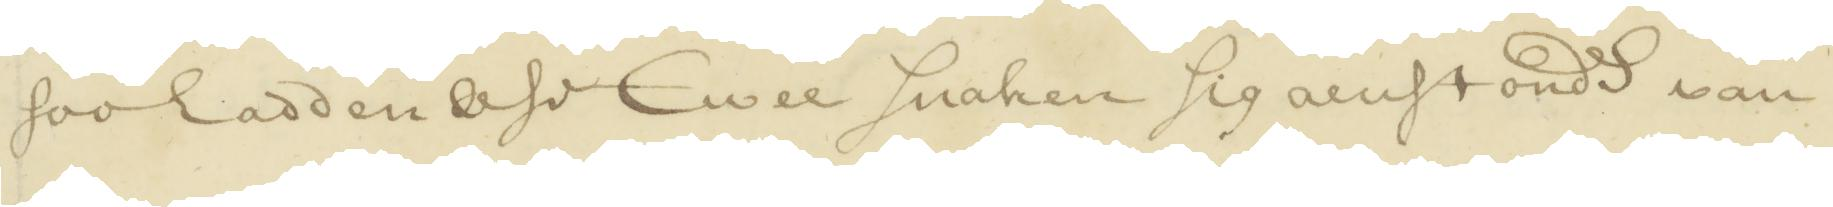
soo hadden dese Twee Snaken Sig aenstonds van
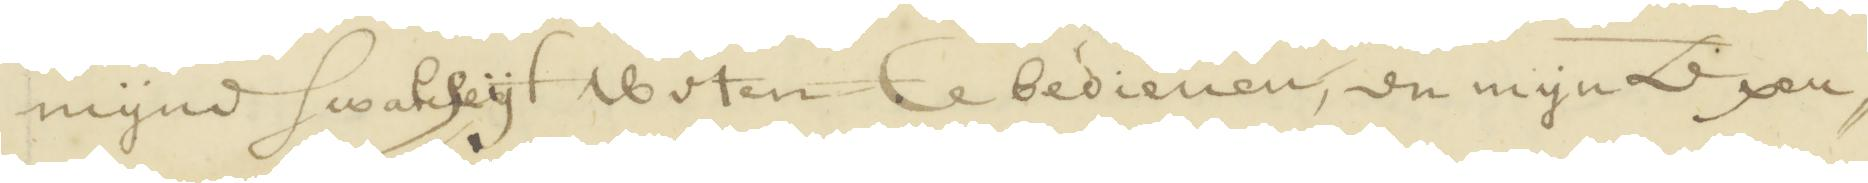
mijne Swakheijt weten Te bedienen, en mijn Te per„
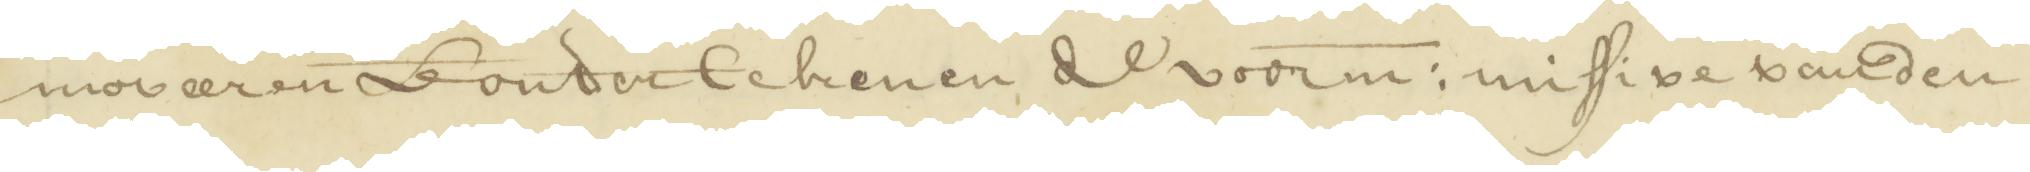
moveeren te ondertekenen de voorm: missive van den
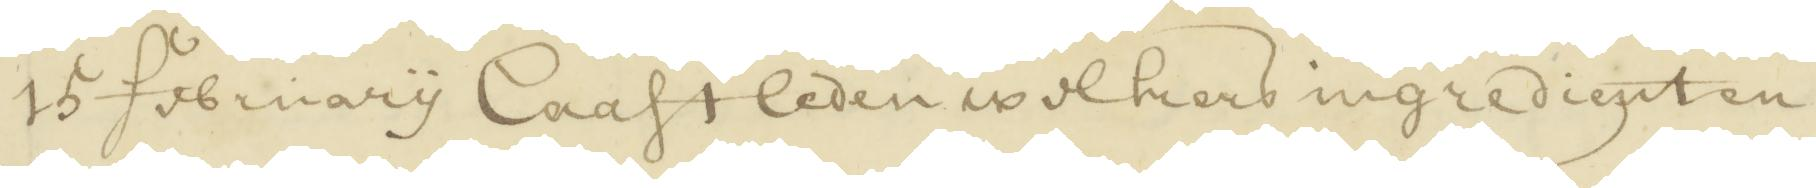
15 februarij Laastleden welkers ingredienten
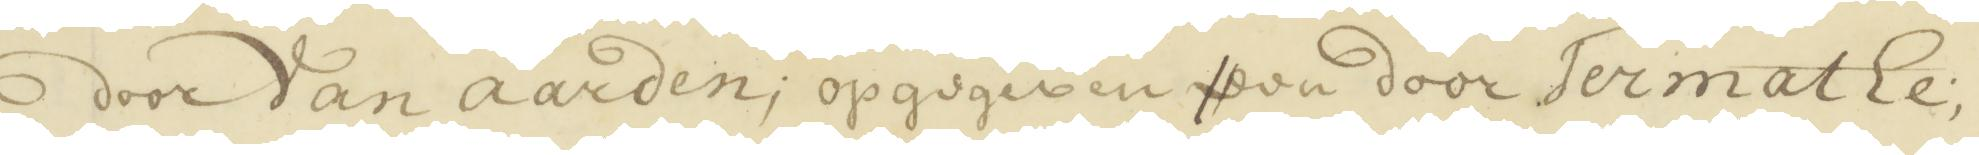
door Van aarden; opgegeven een door Termathe:
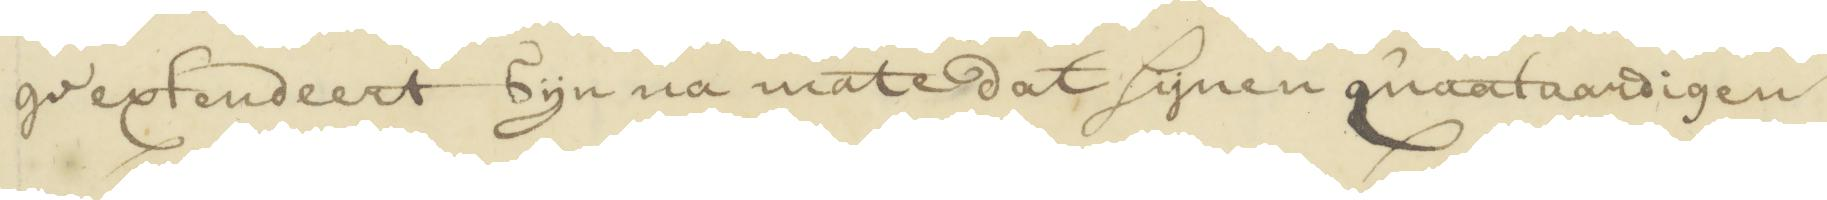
geextendeert sijn na mate dat Sijnen quaataardigen
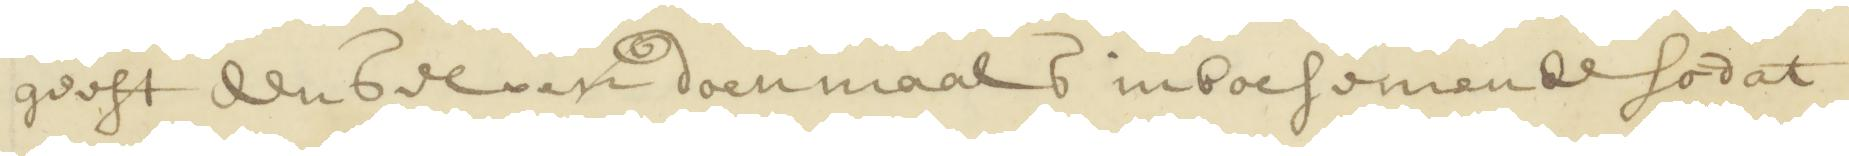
geest den selven doenmaals in boesemende So dat
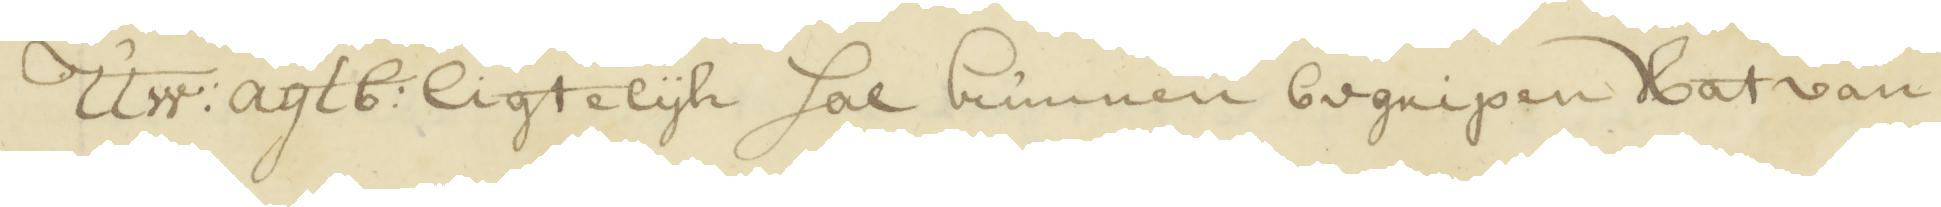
Uw: agtb: ligtelijk Sal kunnen begripen Wat van
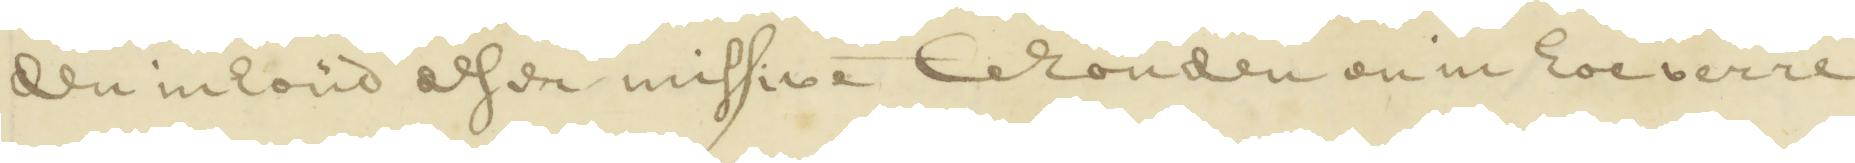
den inhoud deser missive te houden en in hoe verre
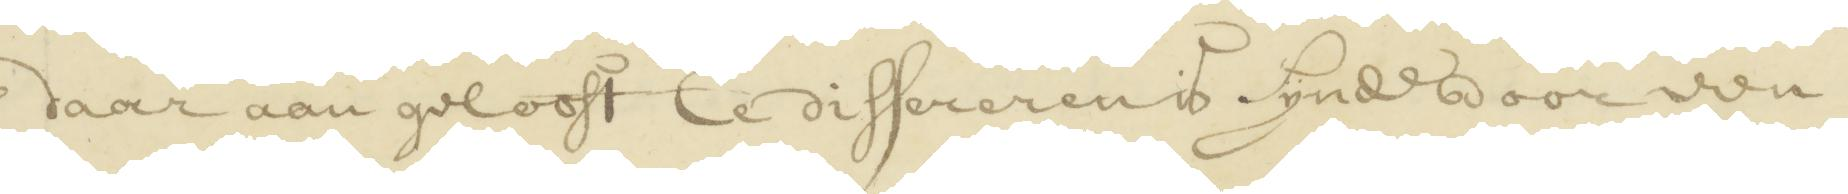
daar aan gelooft Te differeren is Sijnde door een
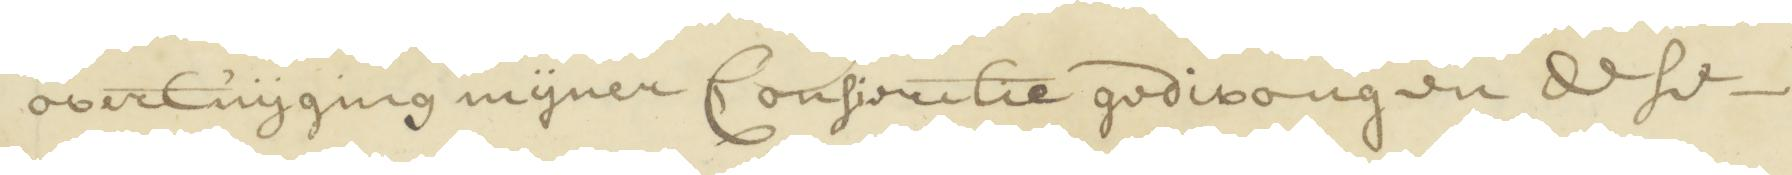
overtuijging mijner Consieritie gedwongen dese
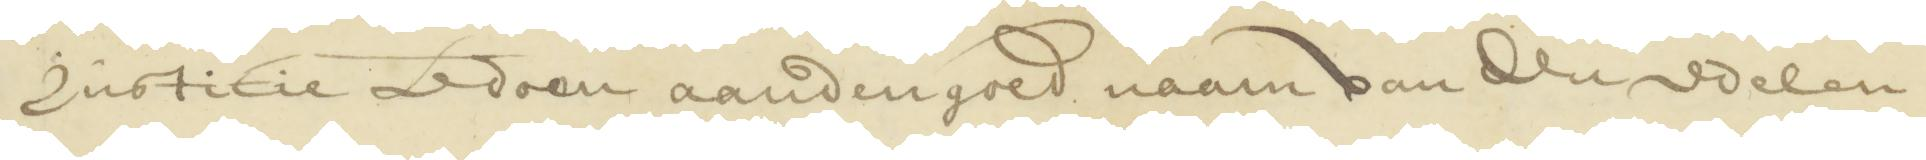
Iustitie te doen aan den goed naam van den edelen
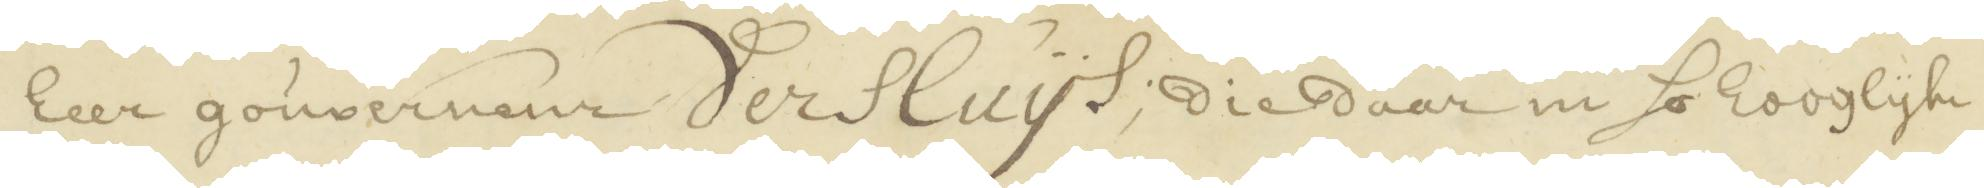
heer gouverneur Versluijs; die daar in So hooglijk
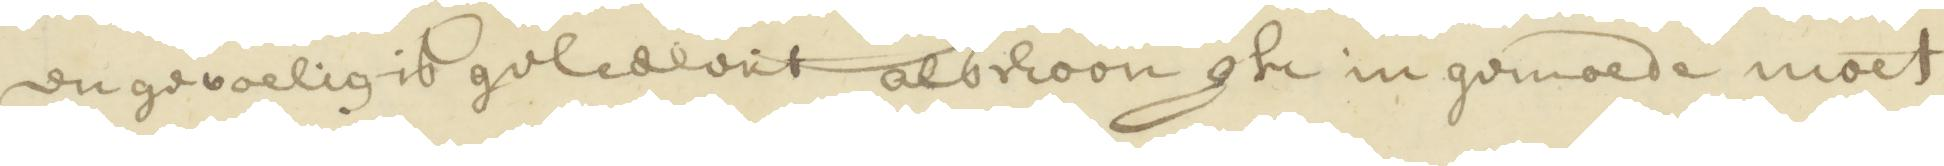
en gevoelig is geledeert alschoon jk in gemoede moet
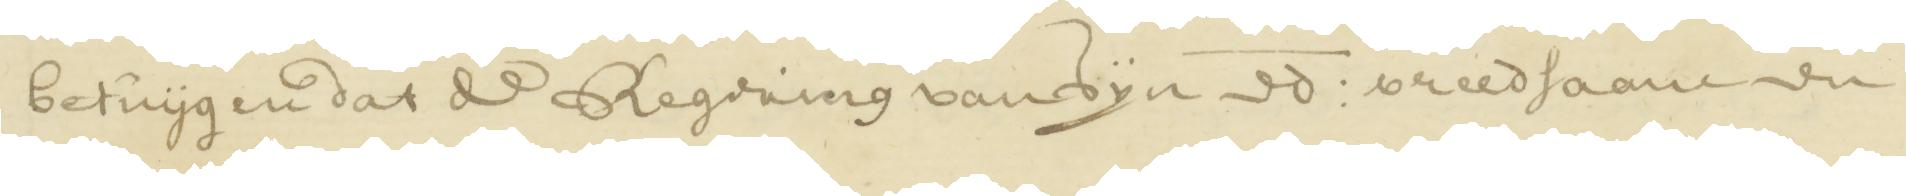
betuijgen dat de Regering van sijn ed: vreedsaam en
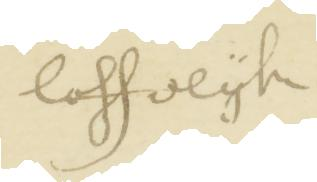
loffelijk
